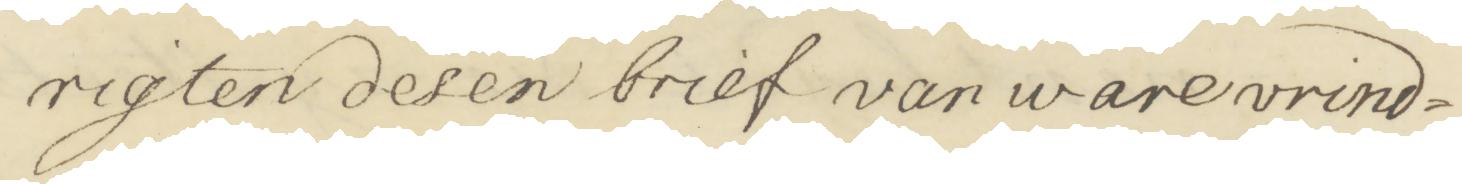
rigten desen brief van ware vrind=
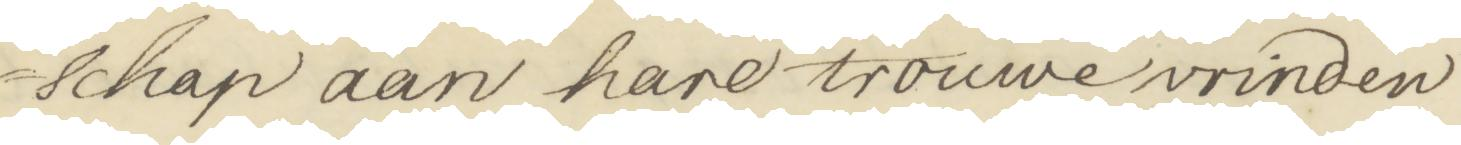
=schap aan hare trouwe vrinden
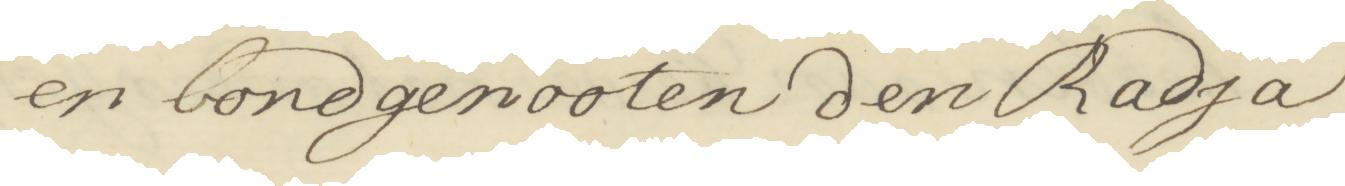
en bondgenooten den Radja
